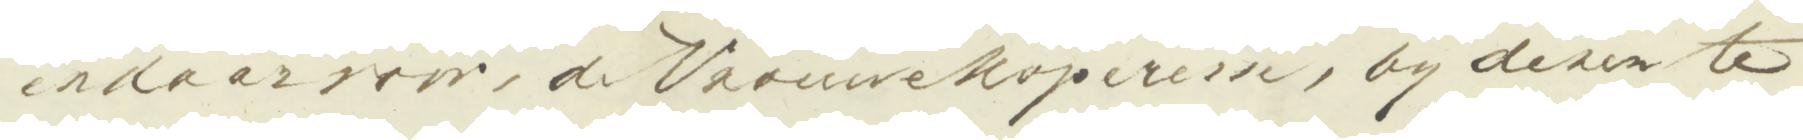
en daar voor, de Vrouwe koperesse, by dezen te
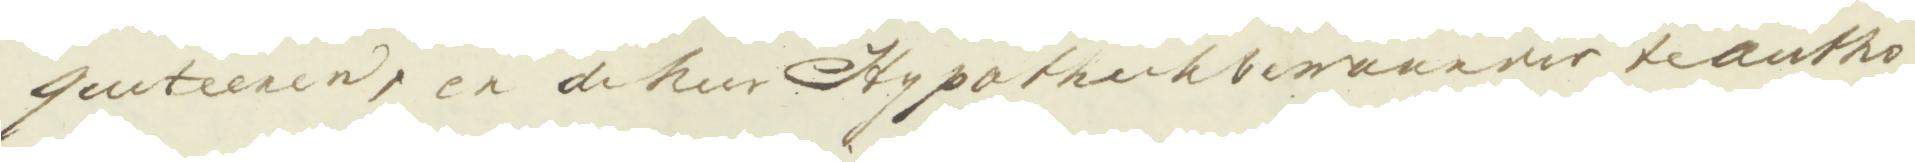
quiteeren, en de heer Hypotheekbewaarder te autho
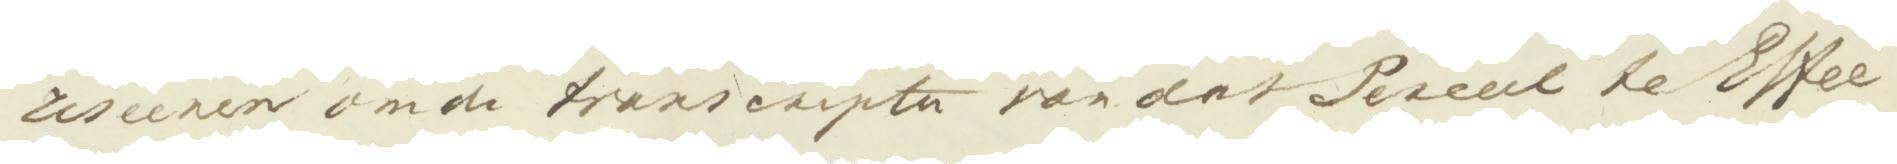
riseeren om de transcriptie van dat Perceel te Effec
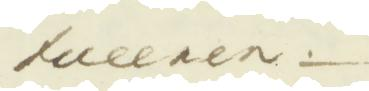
tueeren.
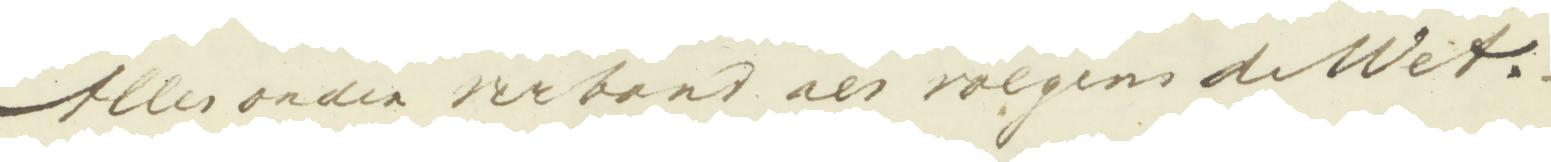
Alles onder verband als volgens de Wet.
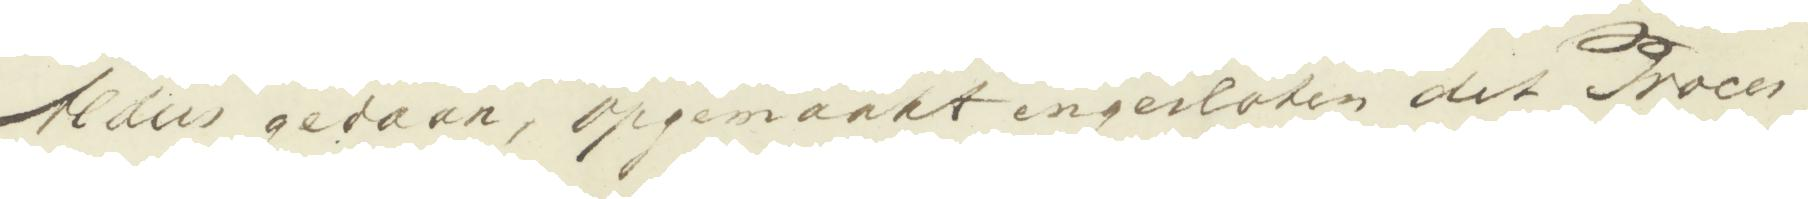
Aldus gedaan, opgemaakt en gesloten dit Proces
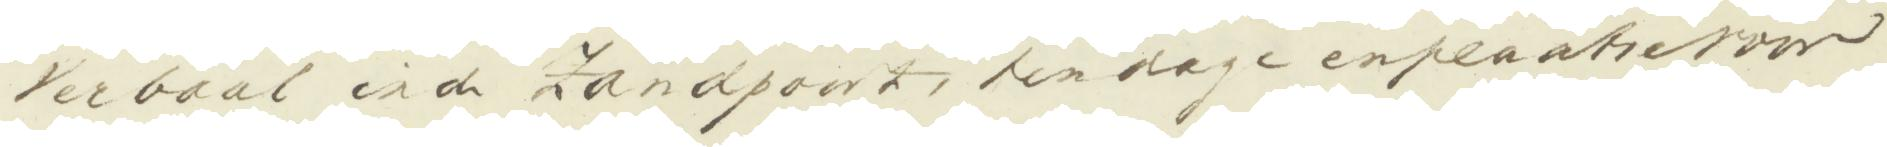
verbaal in de Zandpoort, ten dage en plaatse voor
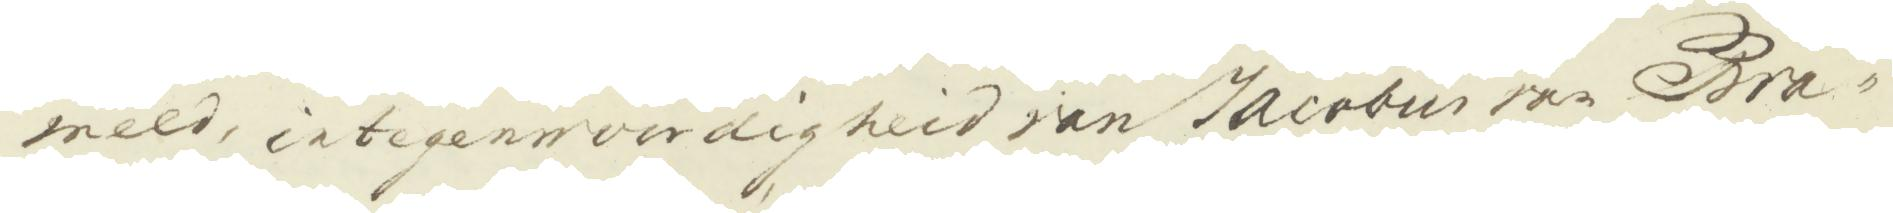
meld, in tegenwoordigheid van Jacobus van Bra„
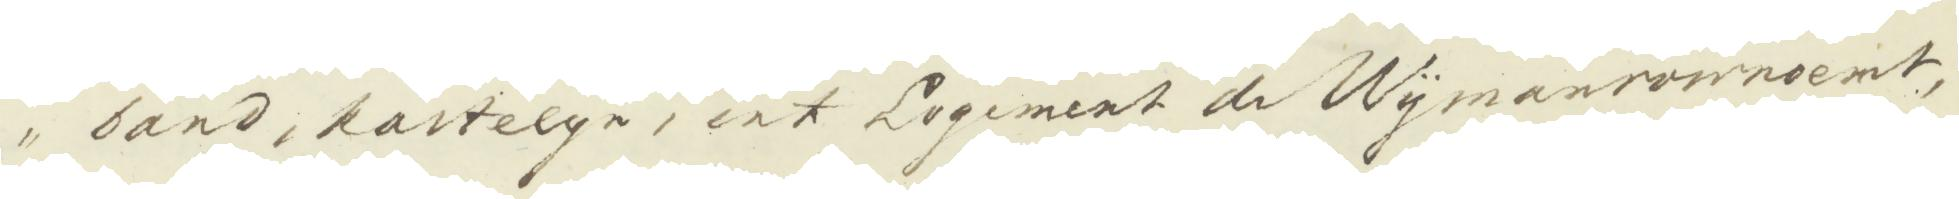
„band, kastelyn, in't Logement de Wijman voornoemt,
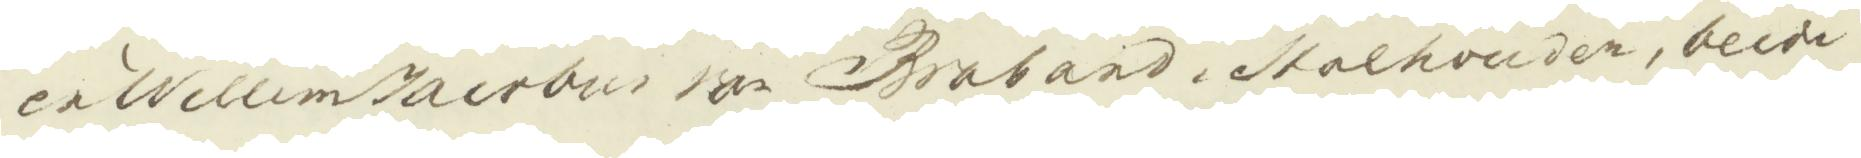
en Willem Jacobus van Braband, stalhouder, beide
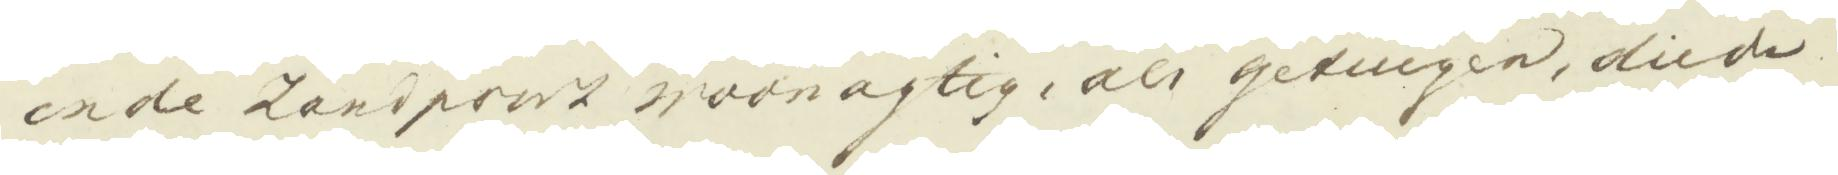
in de Zandpoort woonagtig, als getuigen, die de
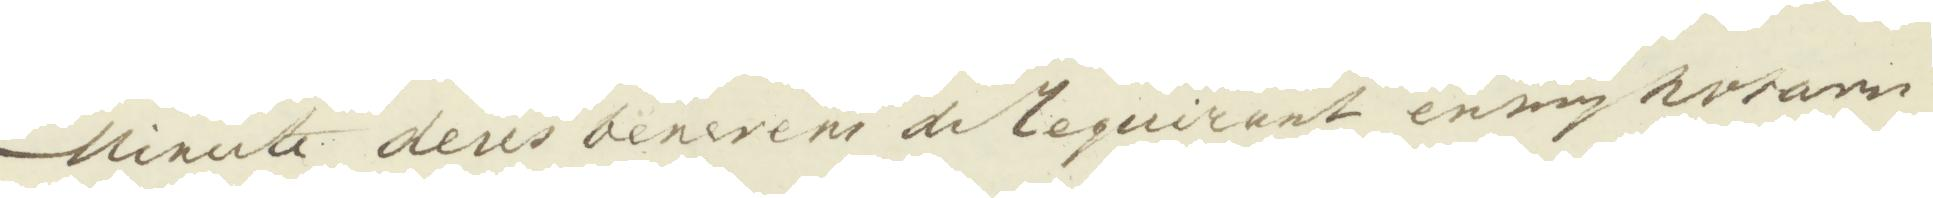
Minute deses benevens de requirant en my notaris
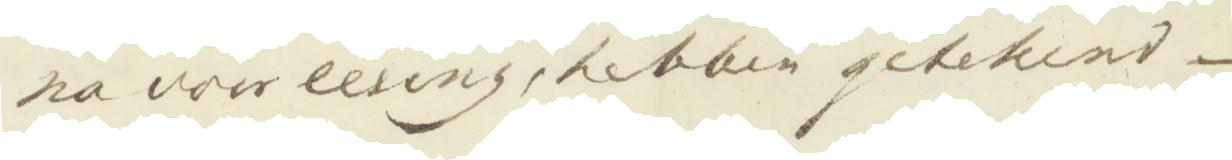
na voorlesing, hebben getekend
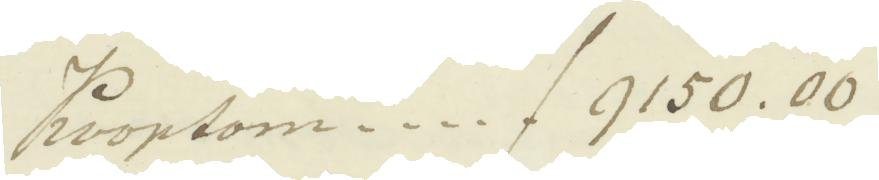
Koopsom . . . . ƒ 9150. 00
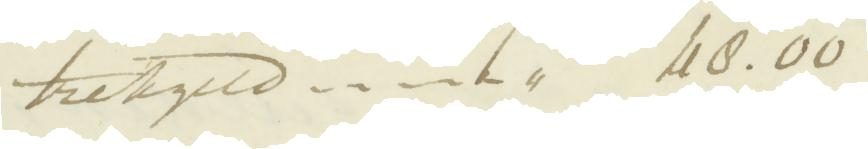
trekgeld . . . . . „ 48. 00
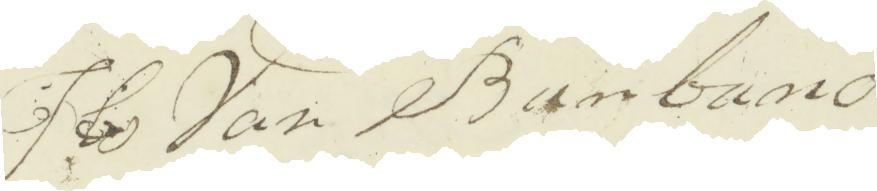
Jbs Van Banband
